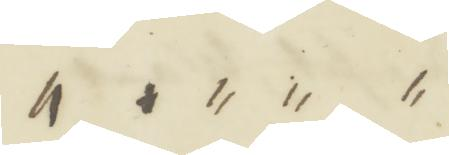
4 „ „ „ „
